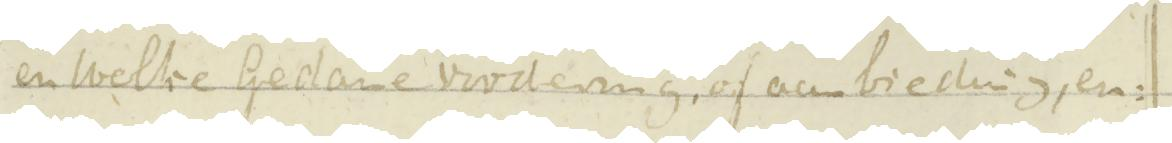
en welke gedane vordering, of aanbieding, en:
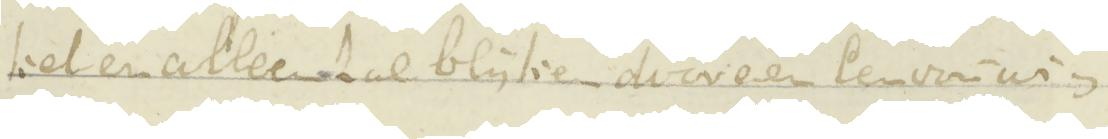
kel en alleen zal blijken door een Eenvoudig
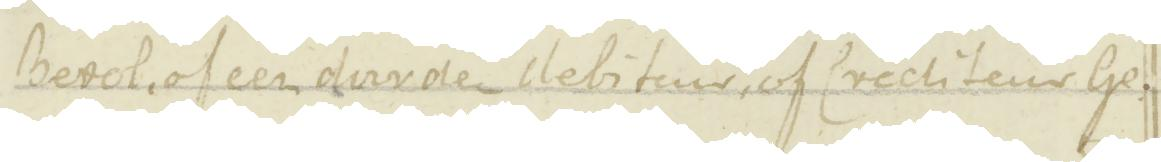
Bevel, of een door den debiteur, of Crediteur Ge:
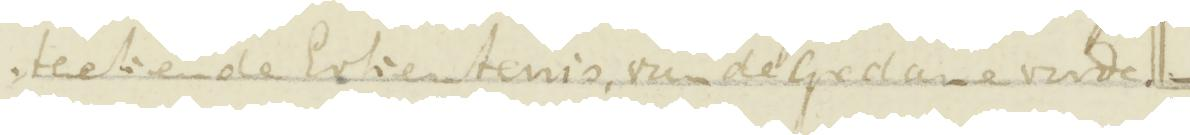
„teekende Erkentenis, van de Gedane vorde.
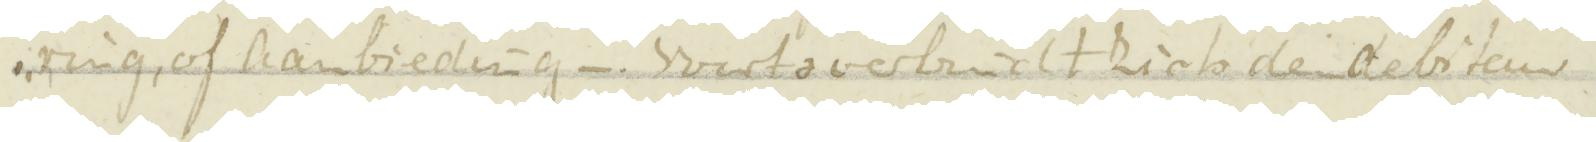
„ring, of aanbieding –. Voorts verbruidt zich den debiteur
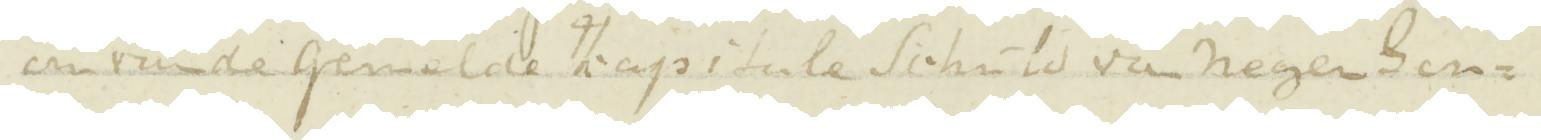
om van de gemelde kapitale schuld van negenhon=
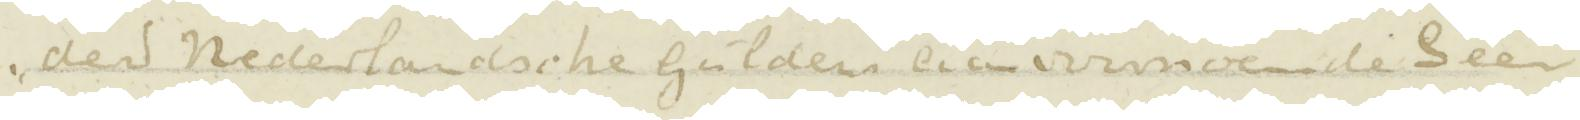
„derd nederlandsche Guldens aan voornoemde heer
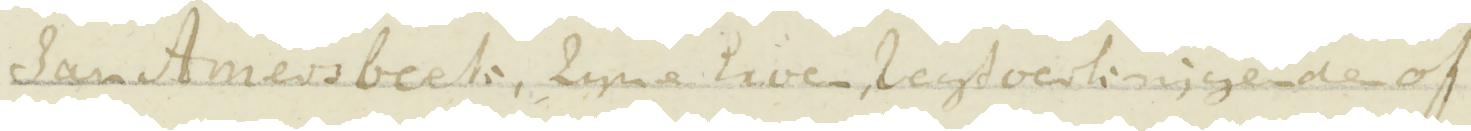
Van Amersbeek, zyne Erven, regtoekrijgende of
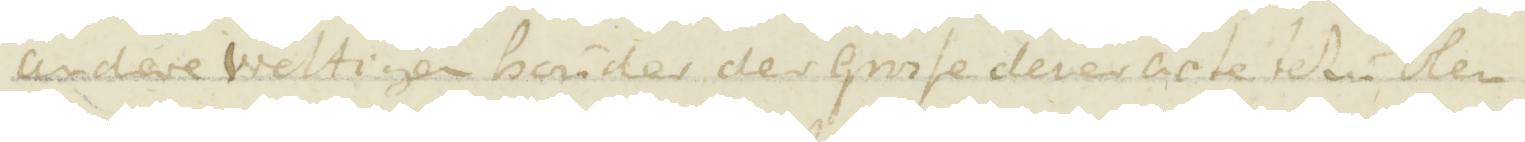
andere wettigen houder der Grosse dezer acte te zullen
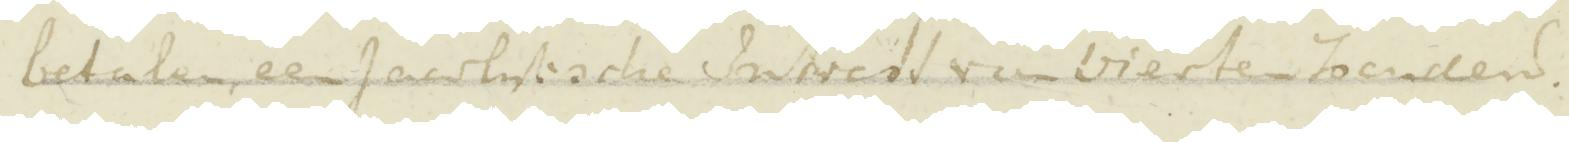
betalen, een Jaarlyksche Jntrest van vierten honderd.
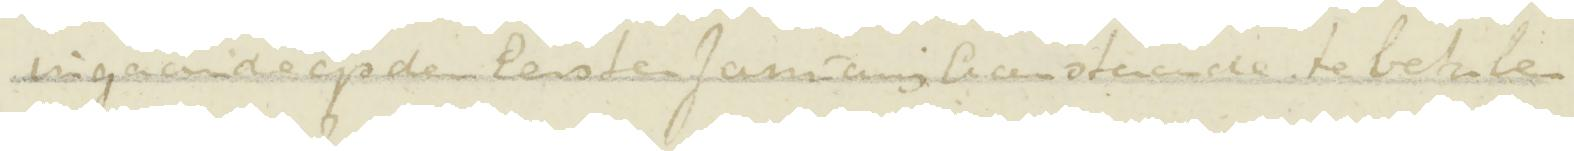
ingaande op den Eersten Januarij Aanstaande te betalen
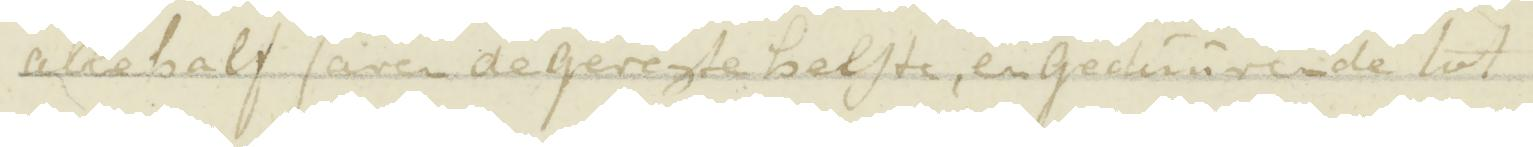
alle half Jaren de geregte helfte, en geduurende tot
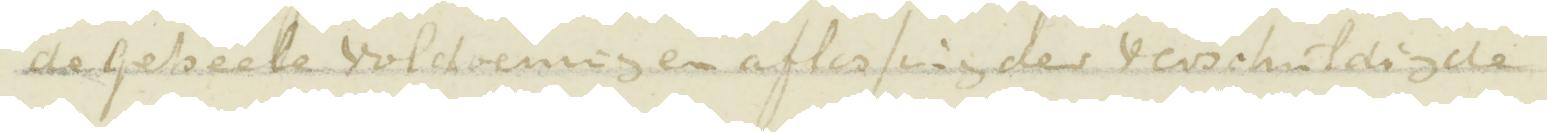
de geheele voldoening aflossing der verschuldigde
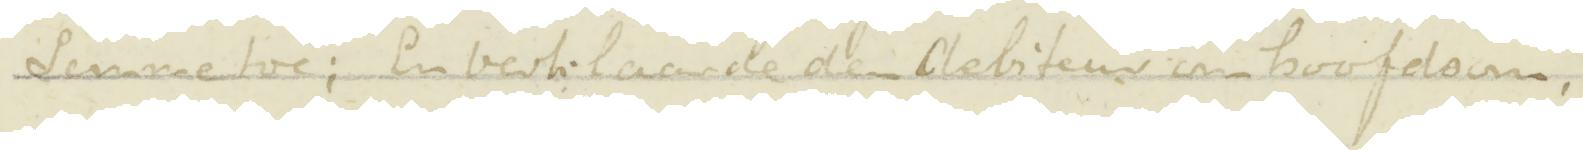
somme toe; En verklaarde den debiteur om hoofdsom,
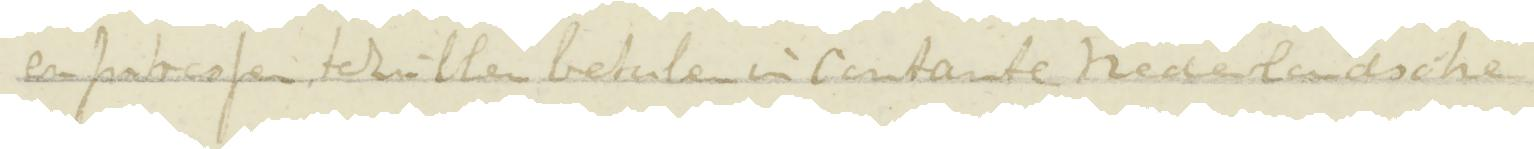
en Jntressen, te zullen betalen in contante nederlandsche
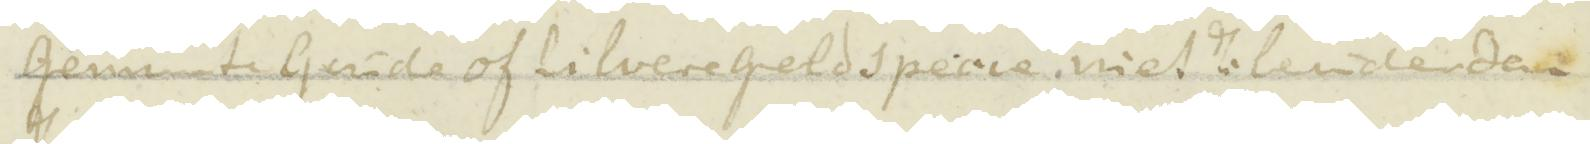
gemunte Goude of zilvere geldspecie niet kleinder dan
